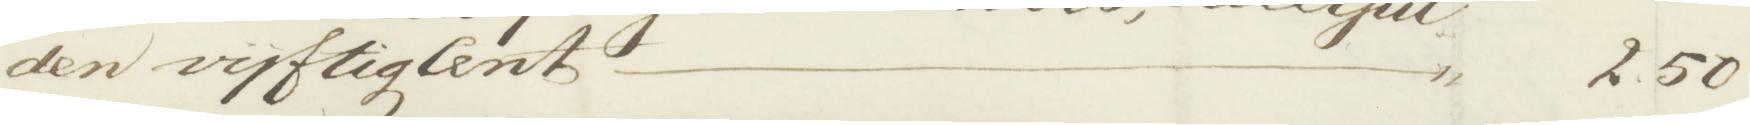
den vijftig Cent —„ 2.50
